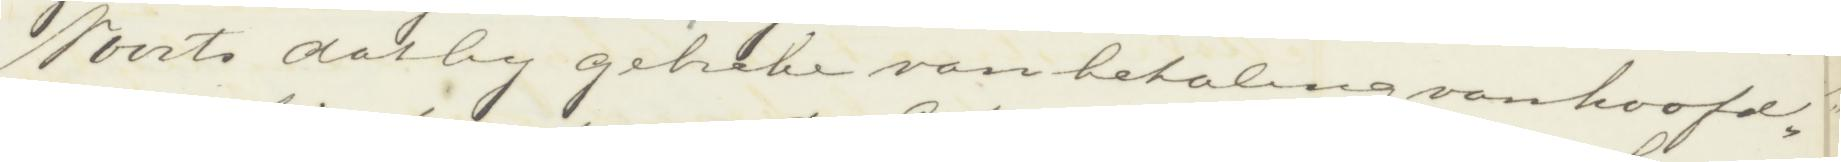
Voorts dat by gebreke van betaling van hoofd„
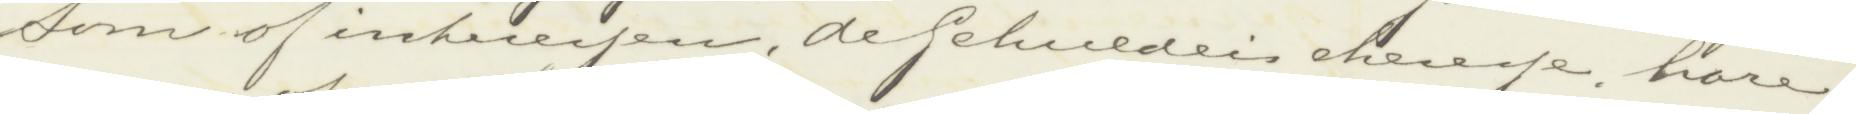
som of interessen, de Schuldeischeresse, hare
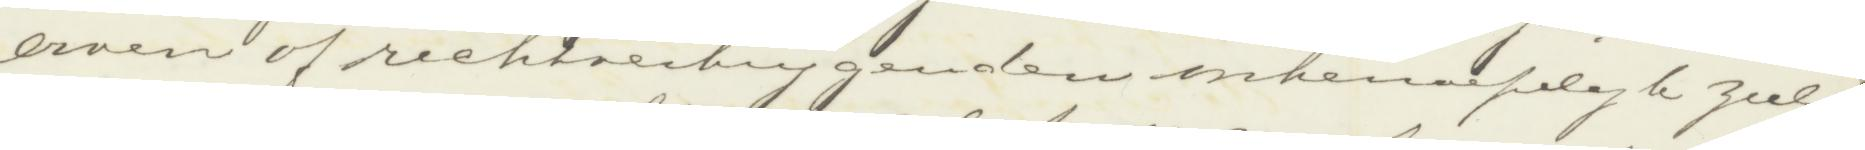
erven of rechtverkrygenden onherroepelyk zul„
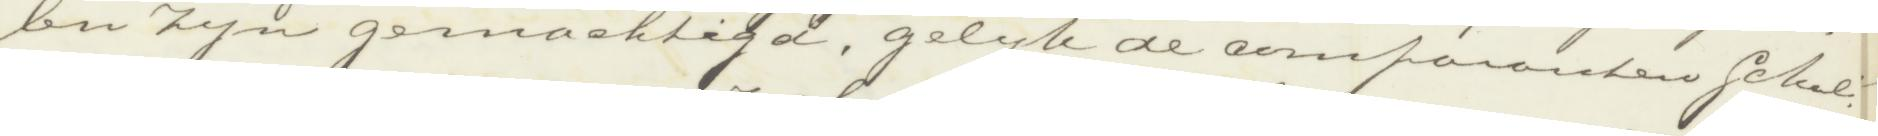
len zyn gemachtigd, gelyk de comparanten Schul„
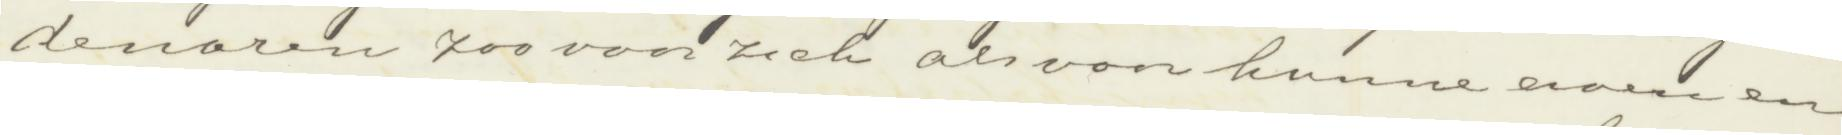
denaren zoo voor zich als voor hunne erven en
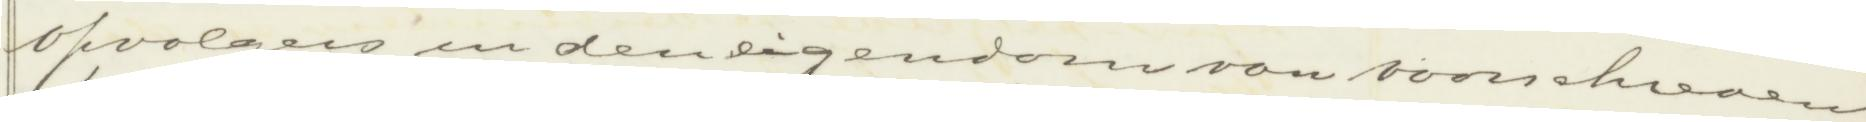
opvolgers in den eigendom van voorschreven
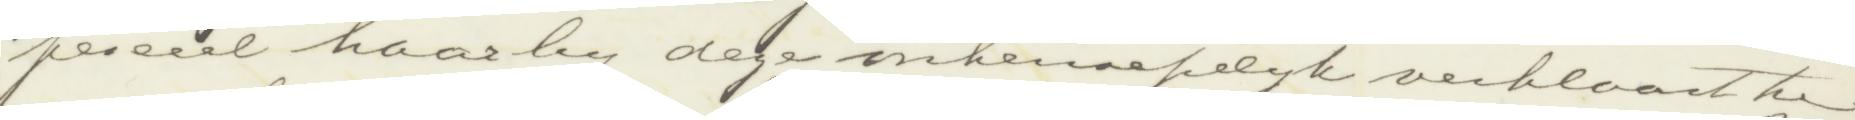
perceel haar by deze onhernoepelyk verklaart te
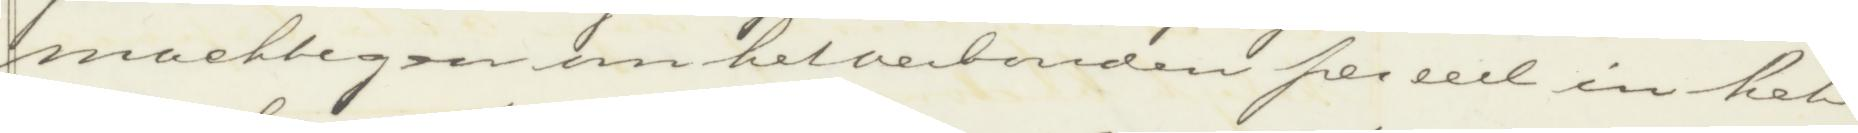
machtigen om het verbonden perceel in het
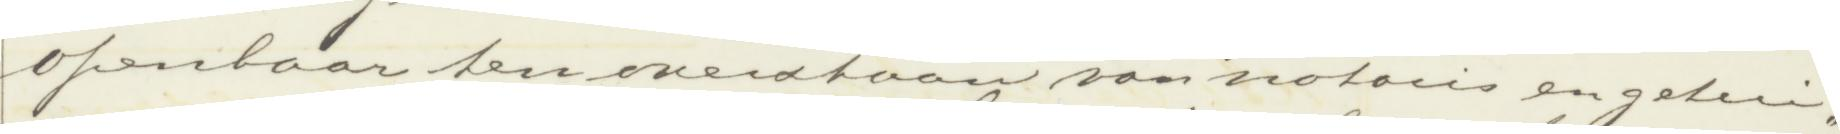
openbaar ten overstaan van notaris en getui„
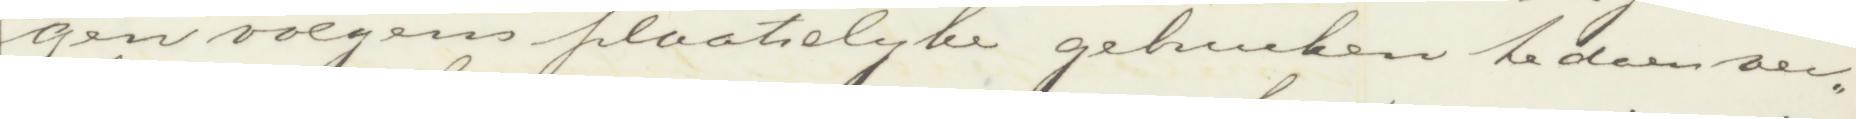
gen volgens plaatselyke gebruiken te doen ver„
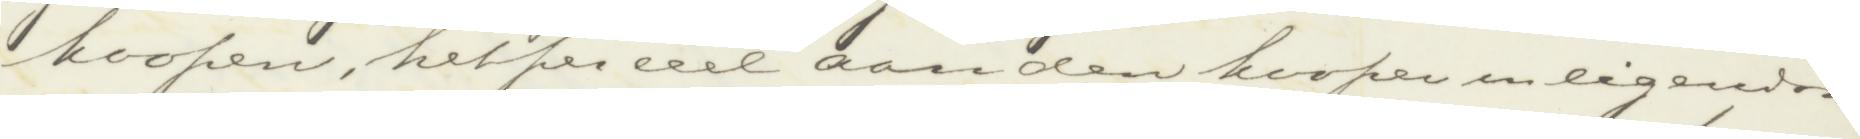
koopen, het perceel aan den kooper in eigendom
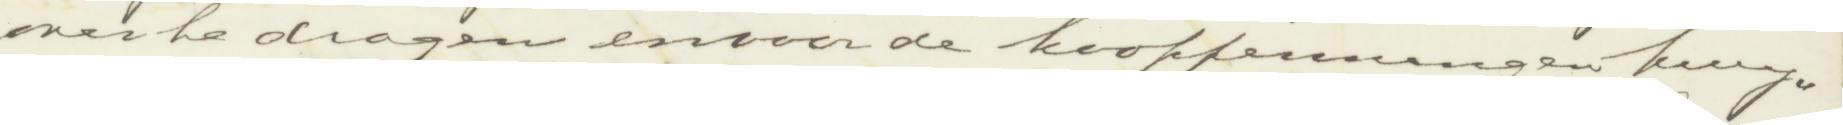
over te dragen en voor de kooppenningen kwy„
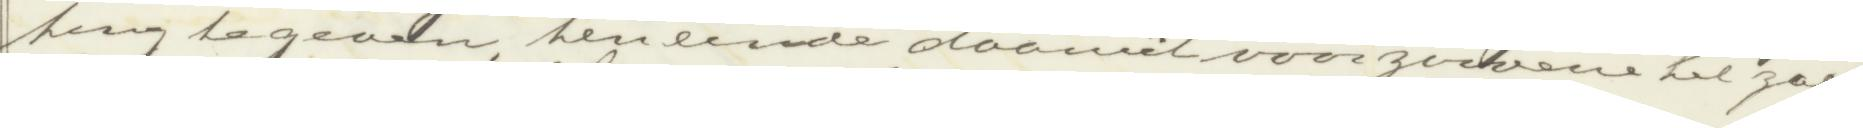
ting tegeven, ten einde daaruit voorzooverre het zal
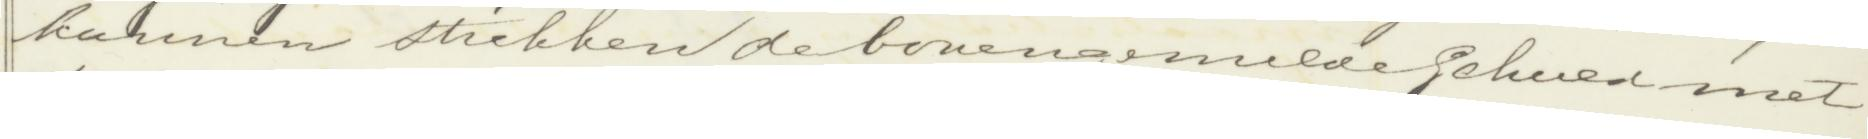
kunnen strekken de bovengemelde Schuld met
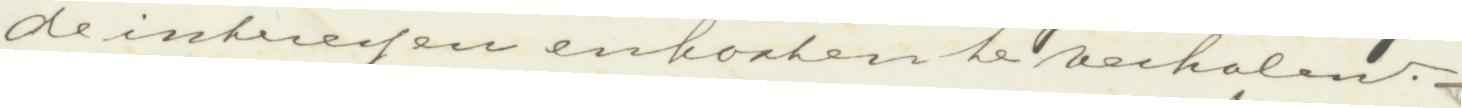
de interessen en kosten te verhalen.-
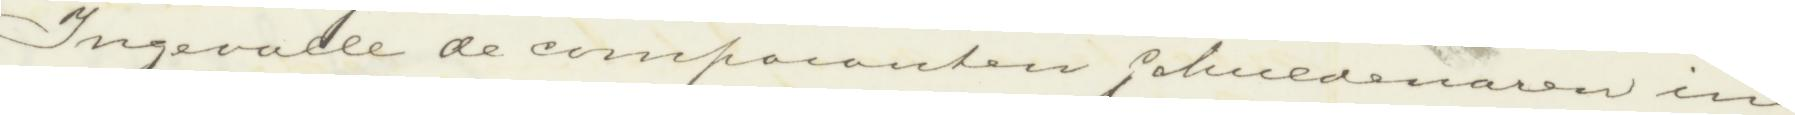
Ingevalle de comparanten Schuldenaren in
